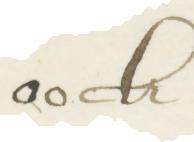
oock
